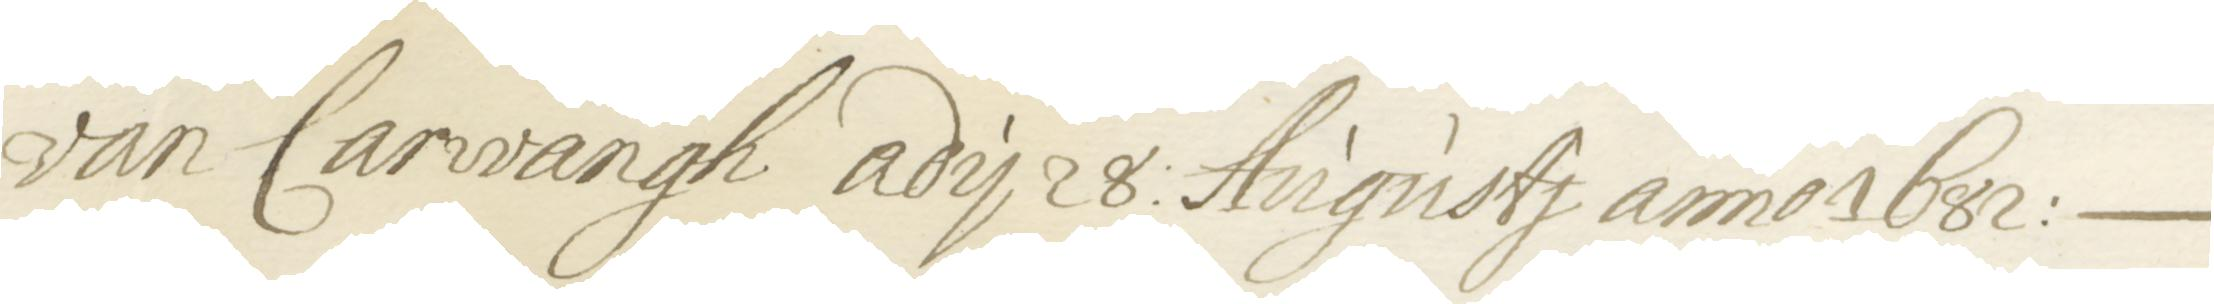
van Carwangh adij 28: Augustj anno 1682: —
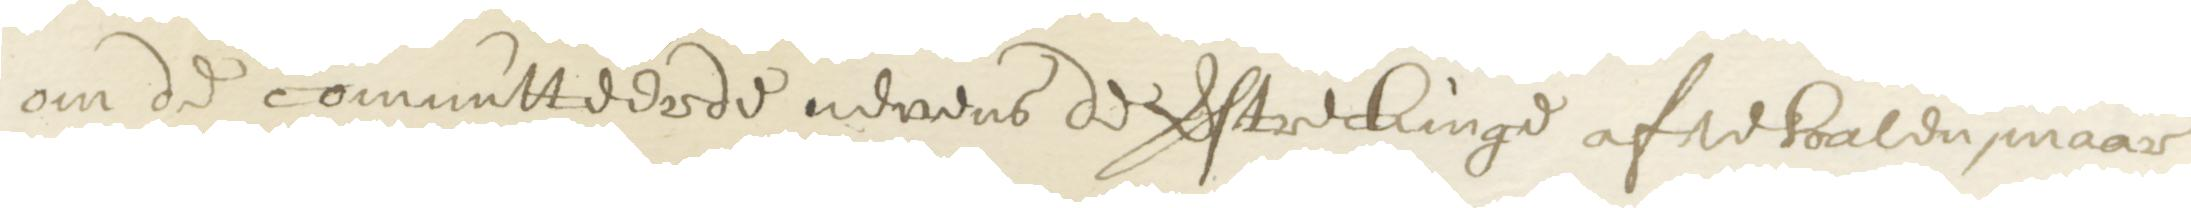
om de committeerde nevens de verstreckinge aftehalen, maar
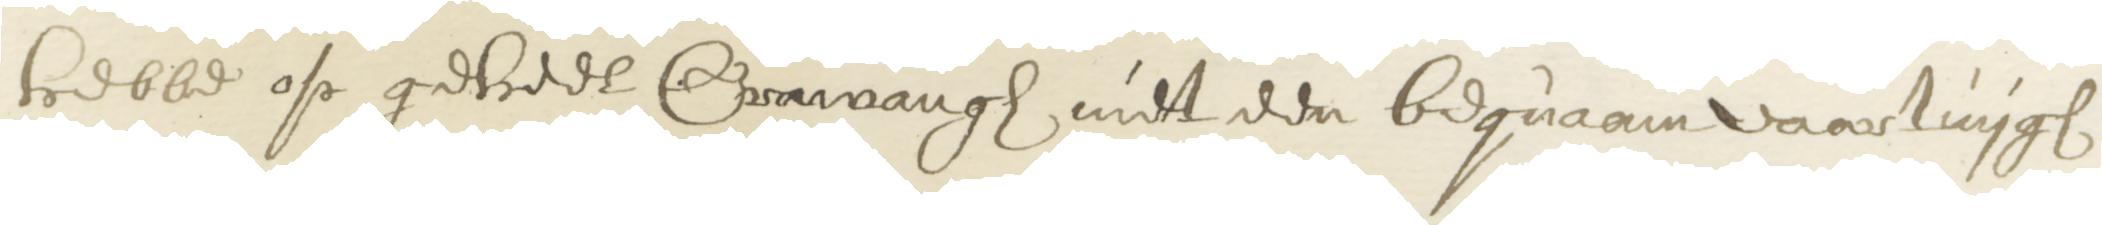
hebbe op geheel Crawangh niet een bequaam vaartuijgh
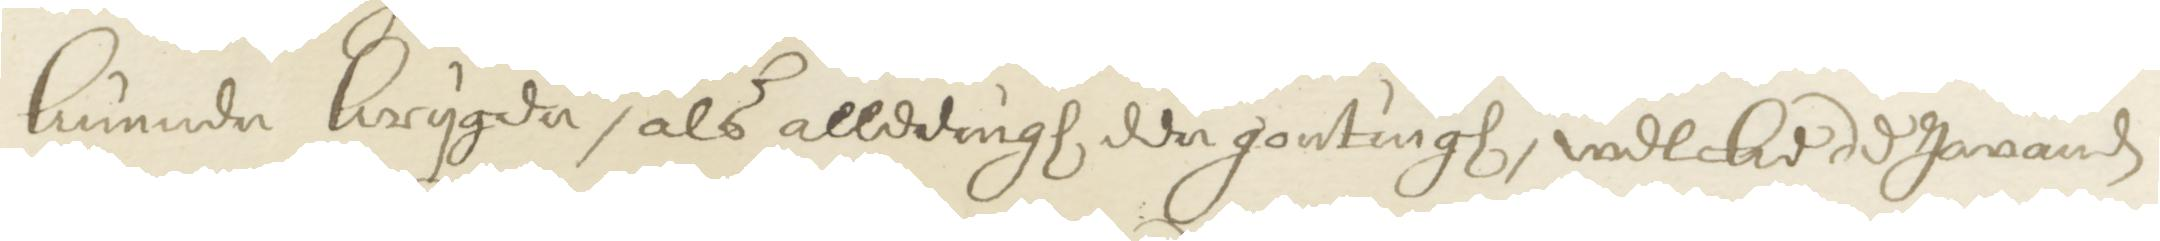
kunnen krijgen, als alleenigh een gontingh, welcke de Javanen
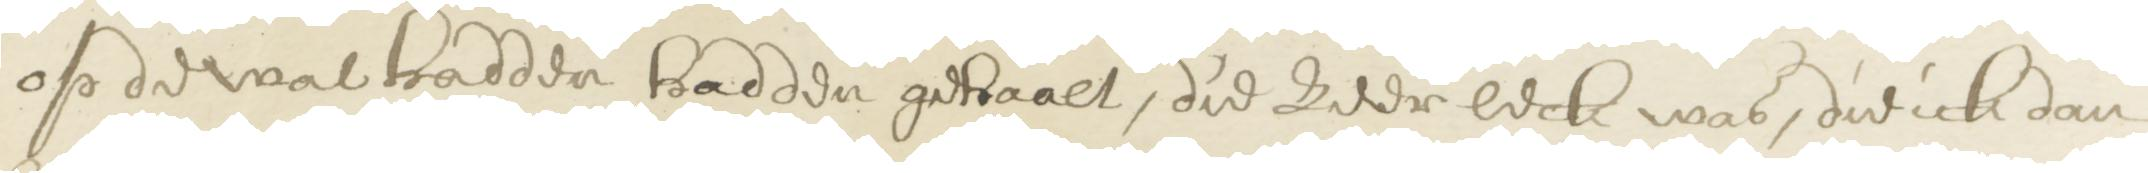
op de wal hadden hadden gehaalt, die zeer leck was, die ick dan
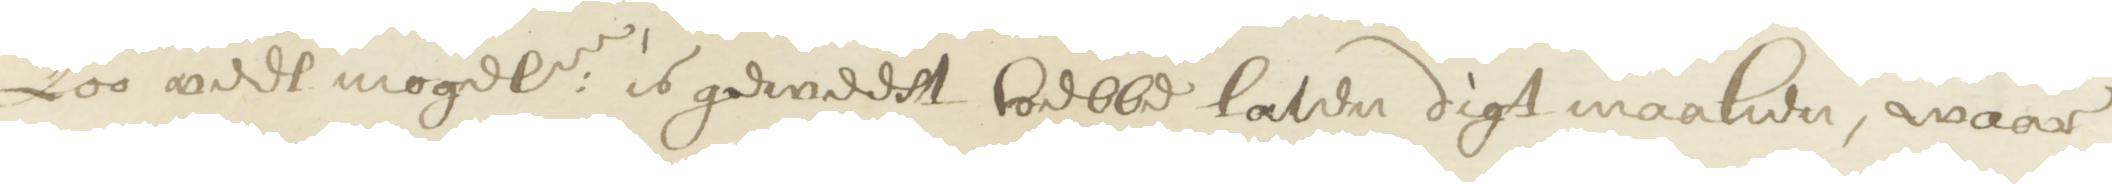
zoo veel mogel: is geweest hebbe laten digt maaken, waar
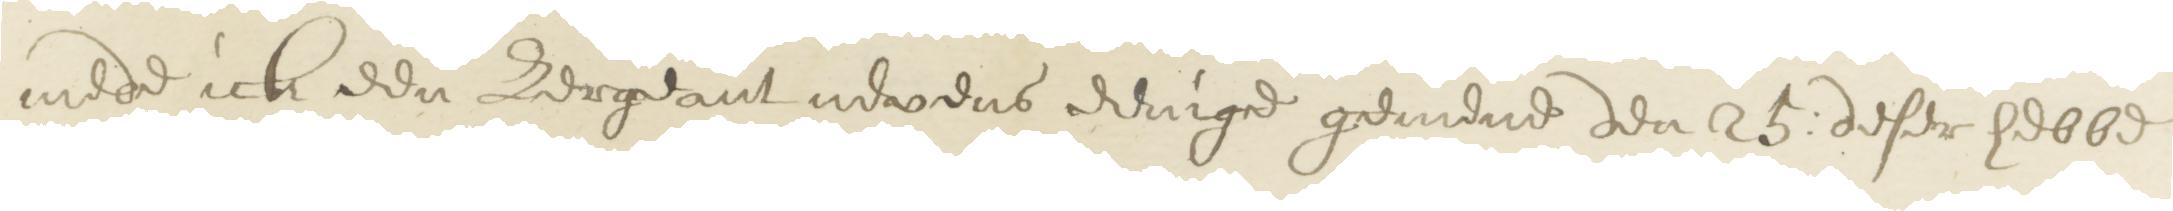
mede ick een zergeant nevens eenige gemene den 25: deser hebbe
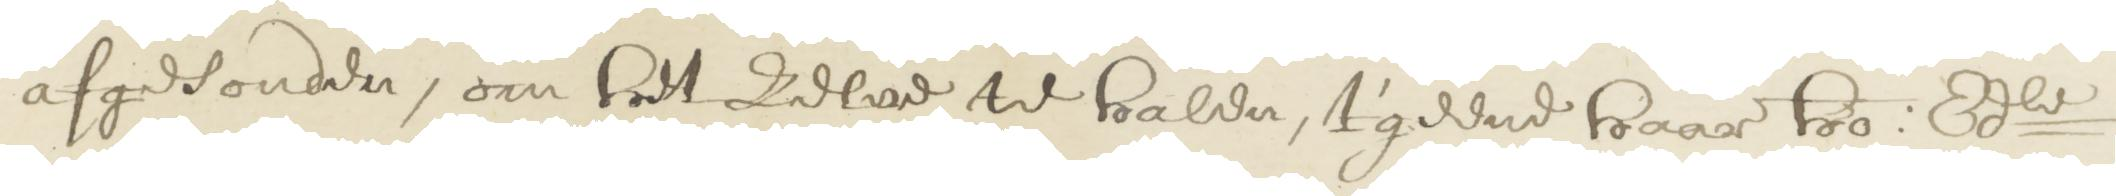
afgesonden, om het zelve te halen, t'geene haar ho: Ed=le
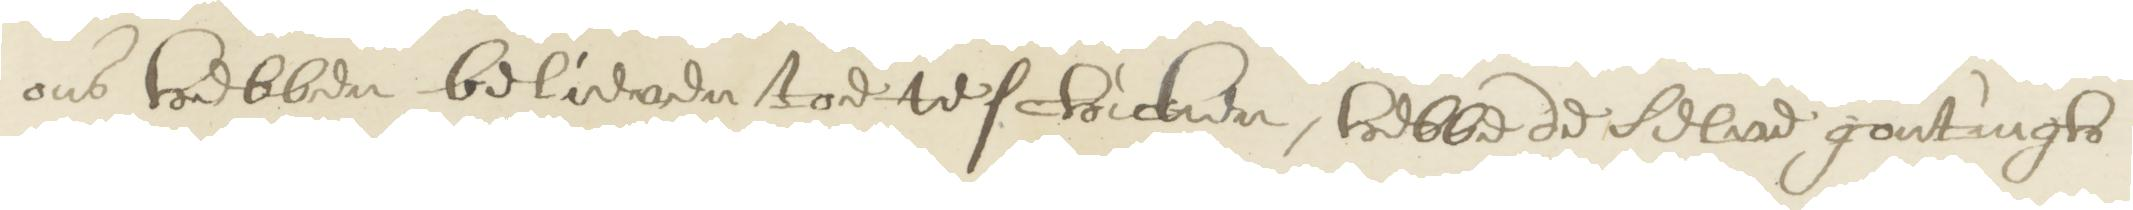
ons hebben believen toe te schicken, hebbe de selve gontingh
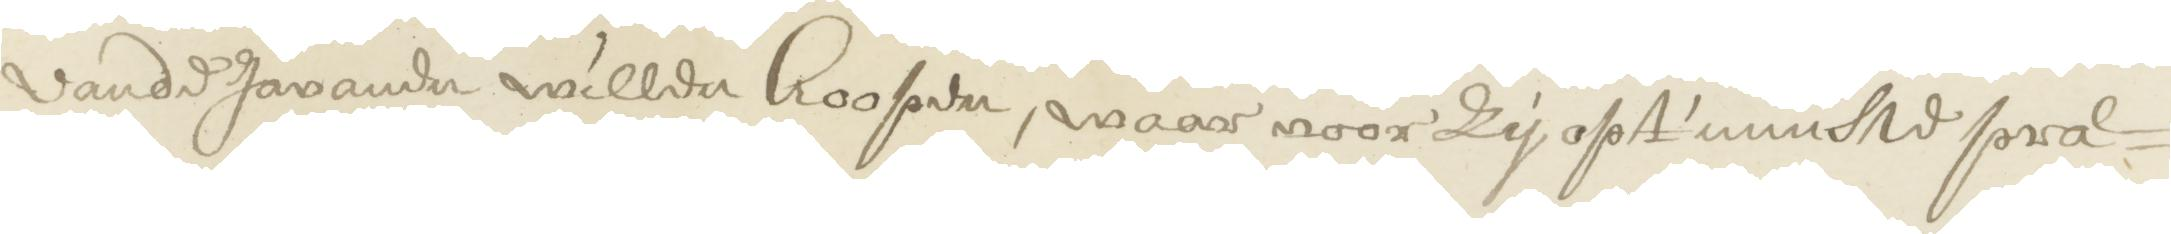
vande Javanen willen koopen, waar voor zij op t'minste prae„
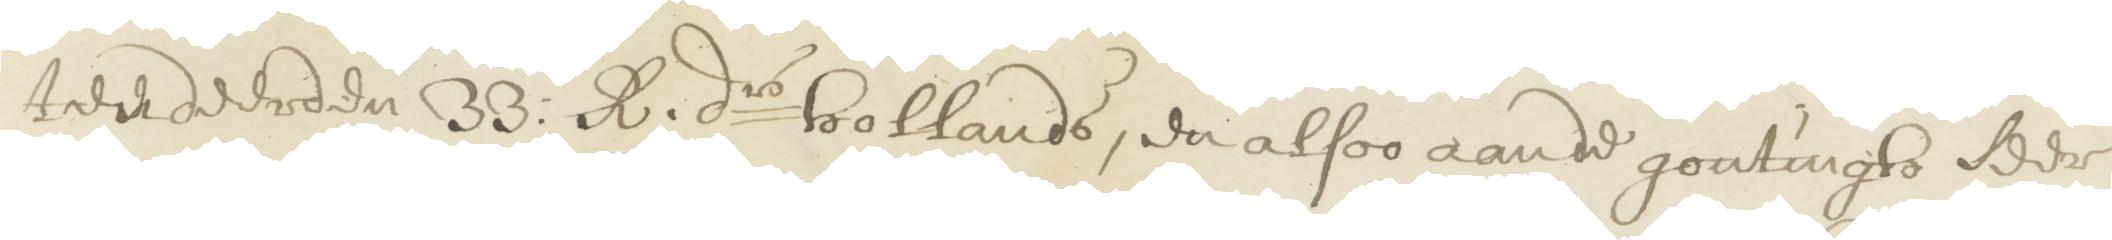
tendeerden 33: R. d=rs hollands, en alsoo aan de gontingh seer
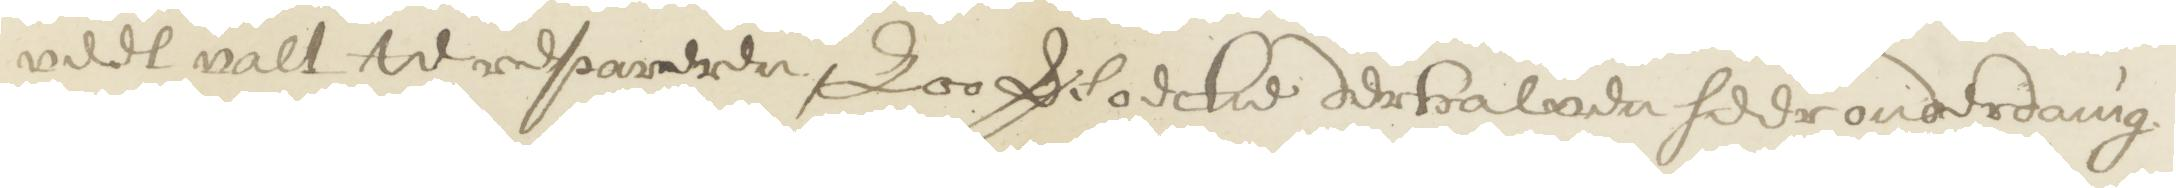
veel valt te repareren, zoo versoecke derhalven seer onderdanig
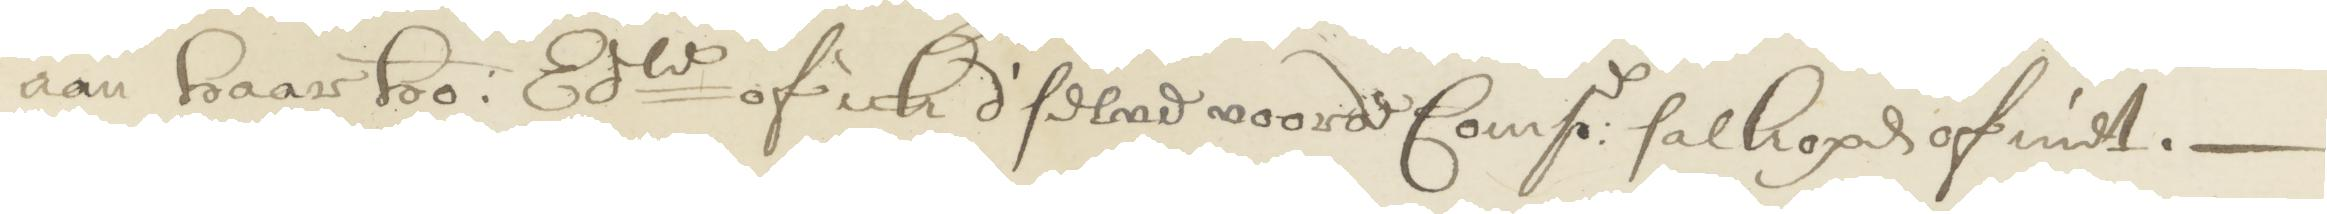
aan haar ho: Ed=le of ick d’selve voorde Comp:s sal kopen of niet. —
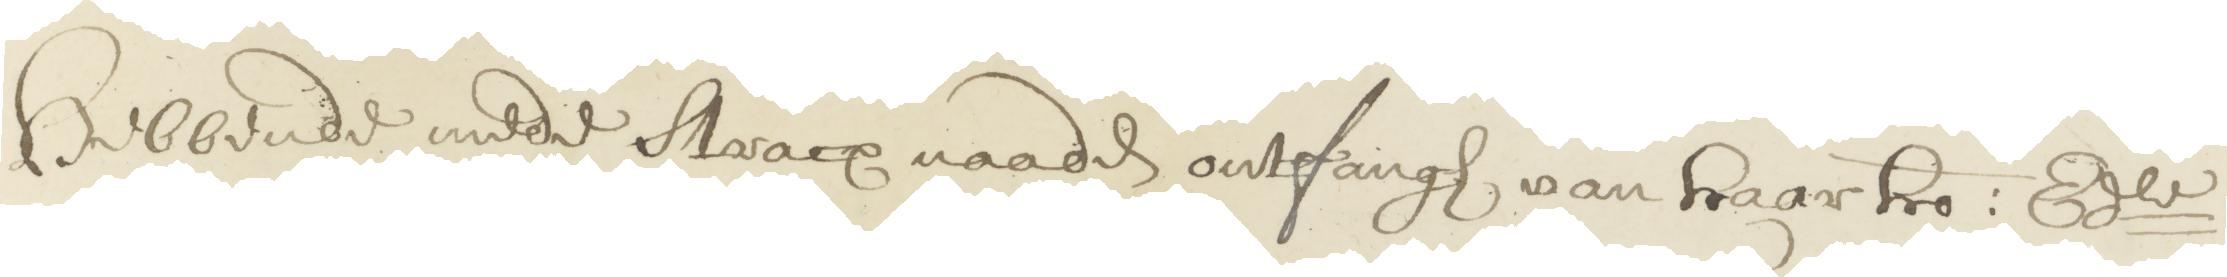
Hebbende mede stracx naaden ontfangh van haar ho: Ed=le
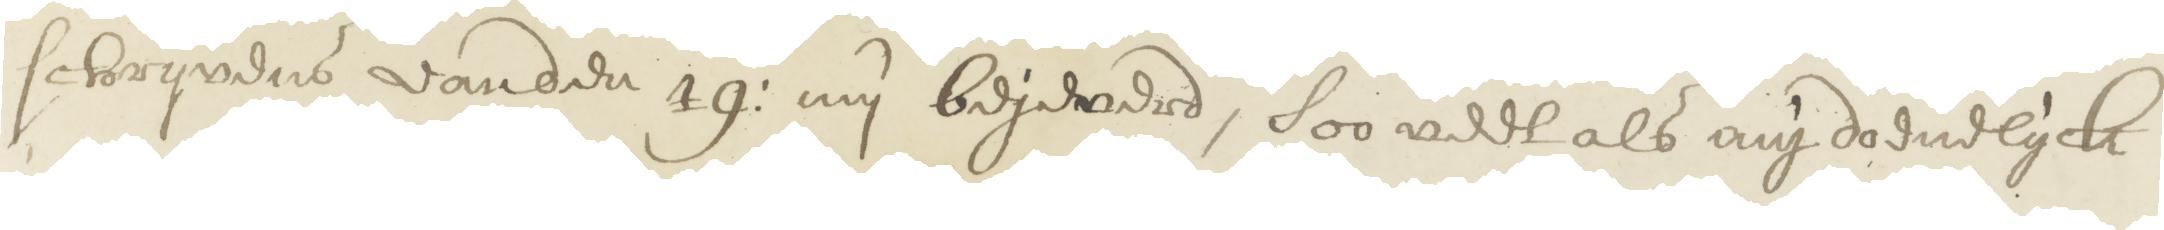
schrijvens van den 19: mij bejeverd, soo veel als mij doenelijck
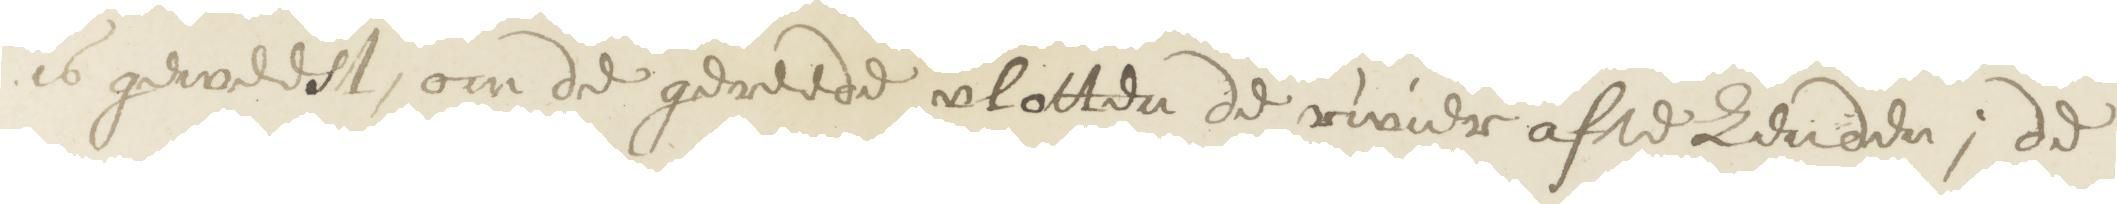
is geweest, om de gereede vlotten de rivier afte zenden; de
